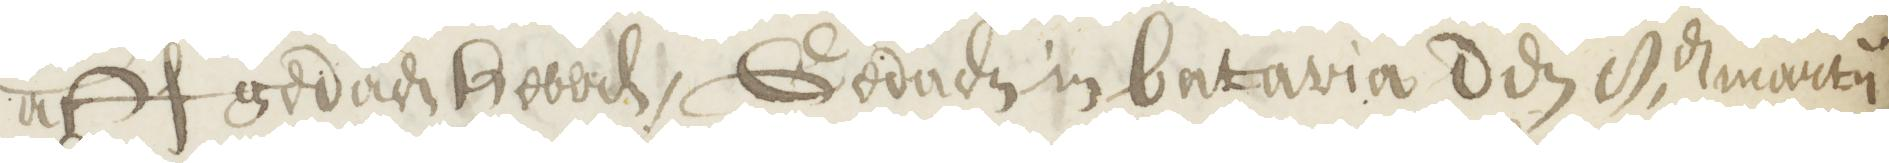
affgedaen hebben, Gedaen in batavia den 8„en martij
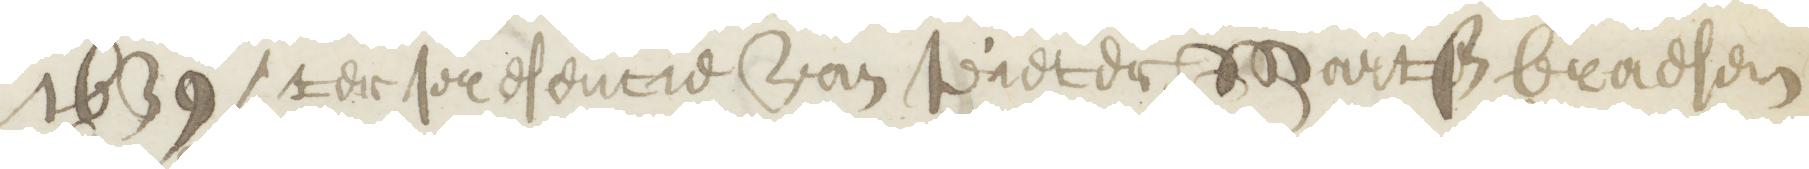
1639/ ter presencie van pieter Martsz braesen
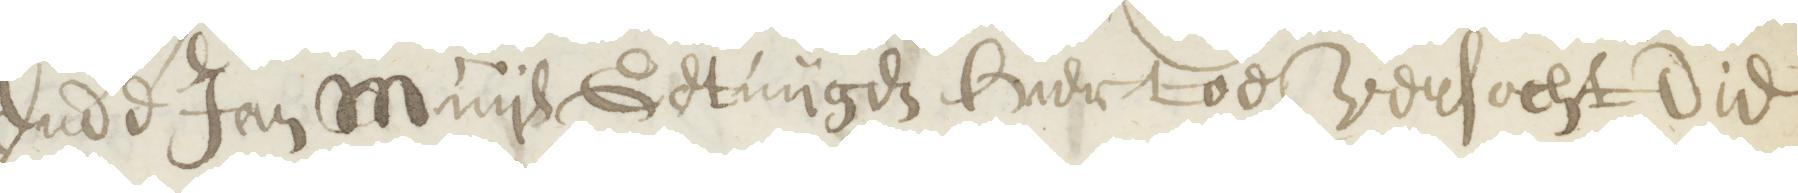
Ende Jan Muijs Getuijgen hier hoe versocht die
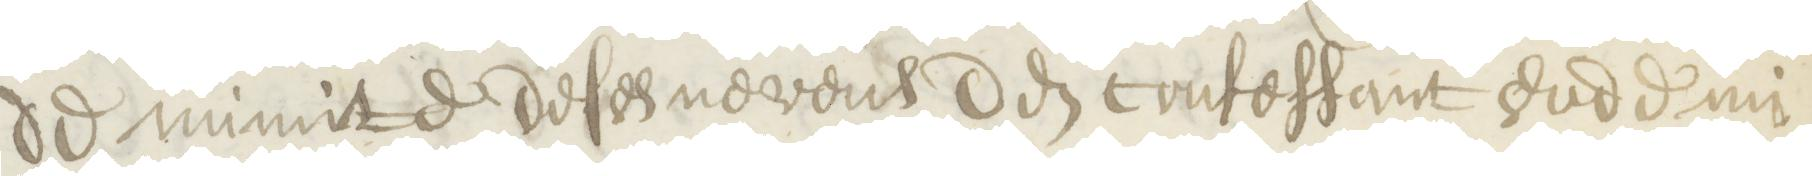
de minute deses nevens den confessant ende mi
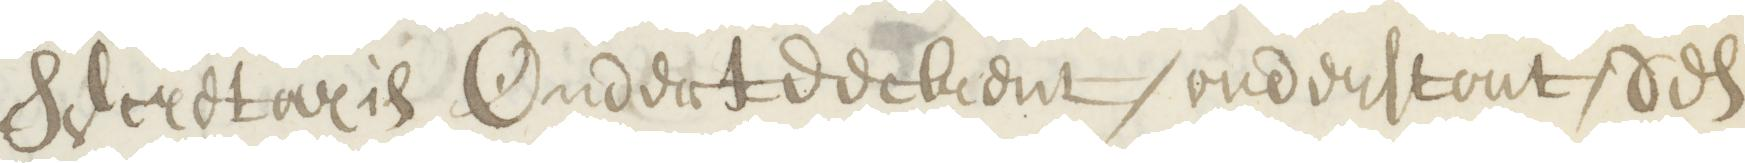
Secretaris Onderteeckent /onderstont/ des
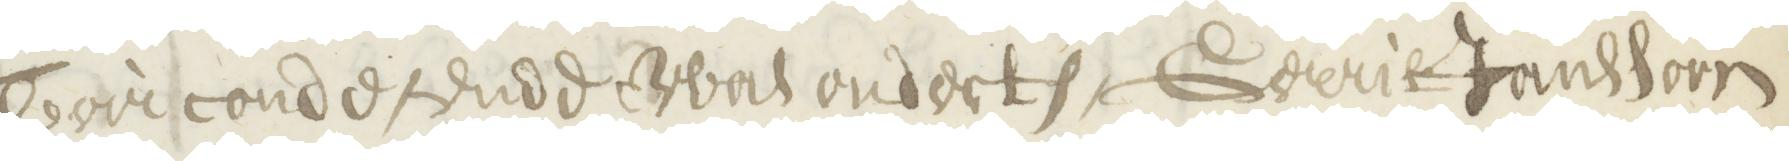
Toirconde, ende was onderts, Gerrit Janssoon
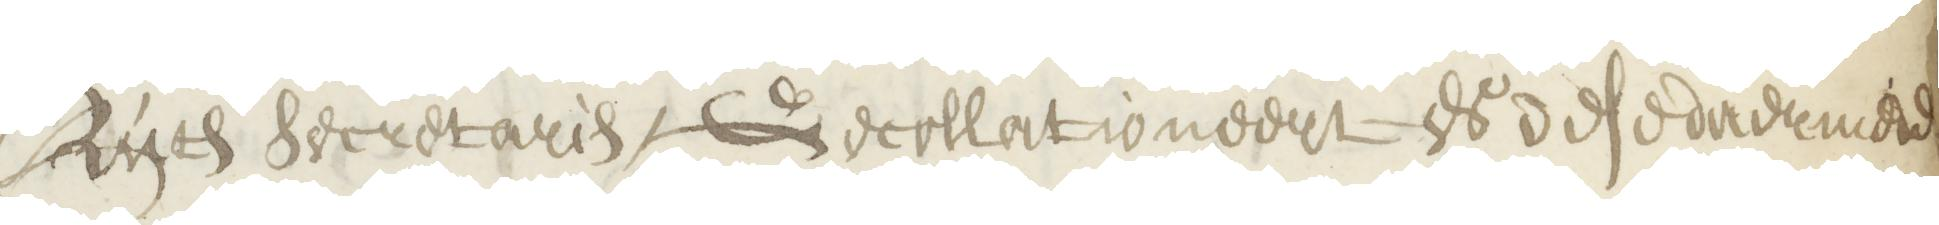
Ruth secretaris/ Gecollationeert en dese daermede
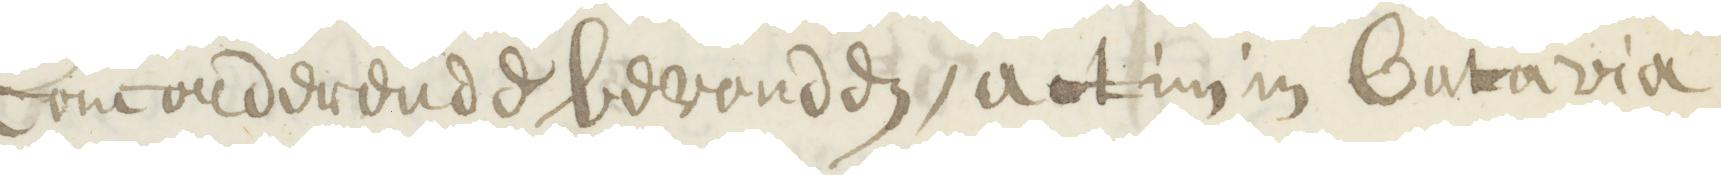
concorderende bevonden, actum in batavia
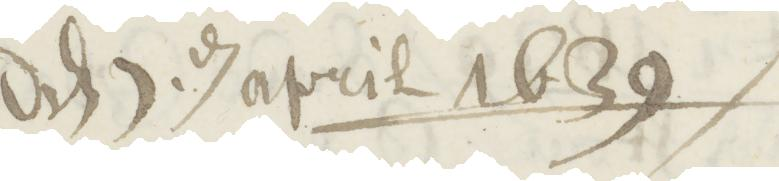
den 7:en april 1639/
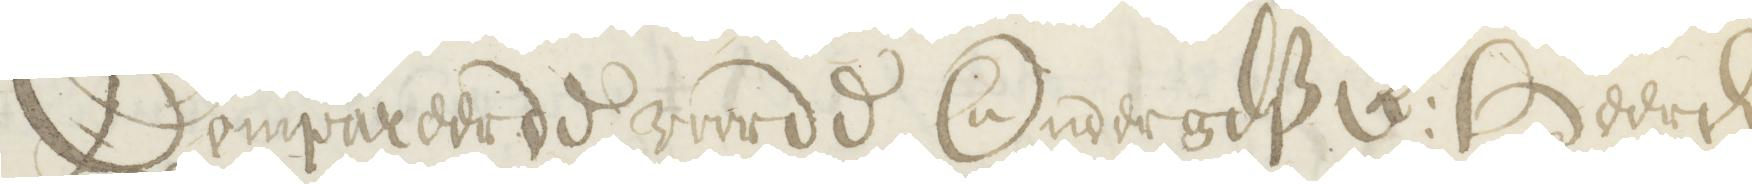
Compareerde voor de Onder gesz E: Heeren
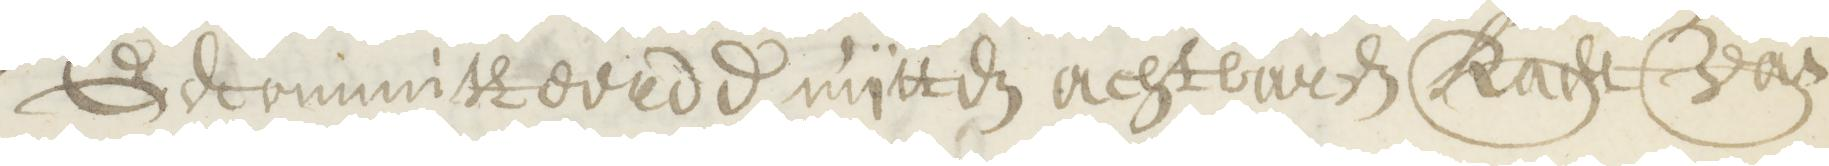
Gecommitteerde uijtten achtbaren Raet Van
